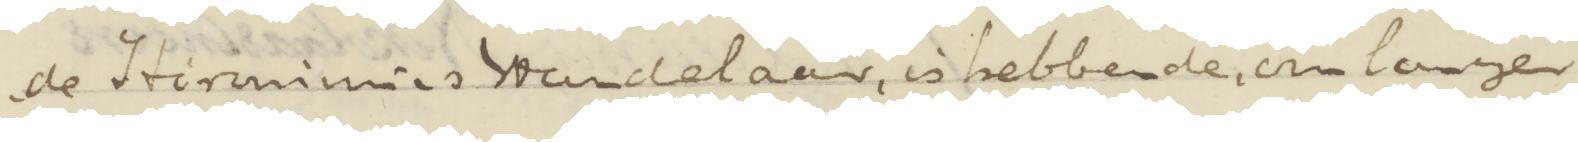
-de Hironimus Wandelaar, is hebbende, om langer
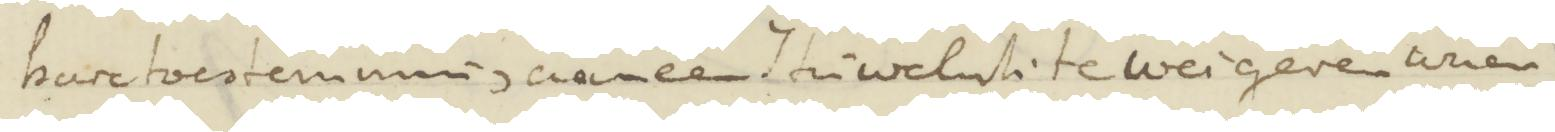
hare toestemming aan een Huwelyk te weigeren waar
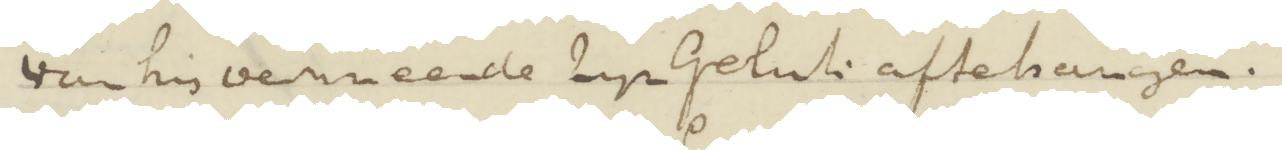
van hy vermeende zyn Geluk aftehangen.
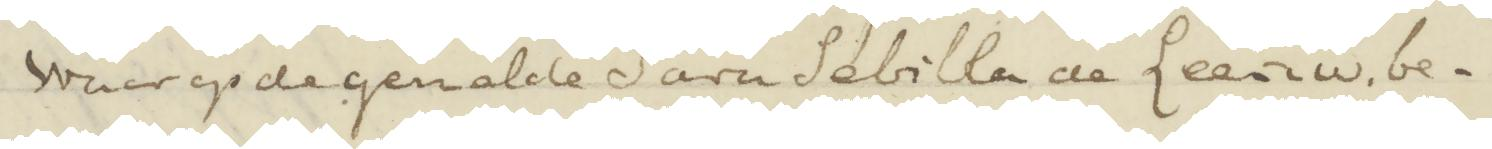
Waar op de gemelde Sara Sebilla de Leeuw, be-
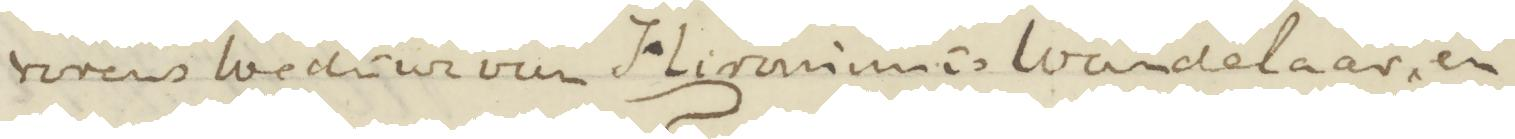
vorens weduwe van Hironimus Wandelaar, en
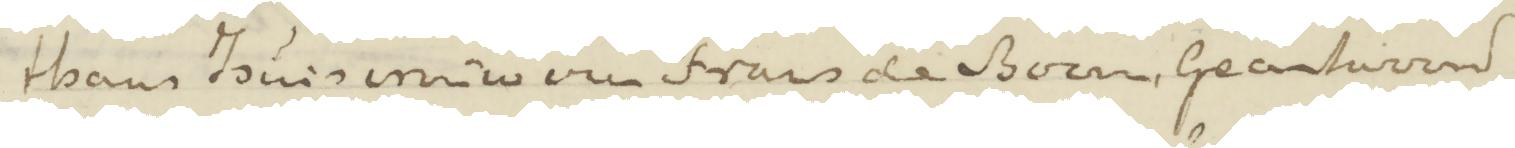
thans huisvrouw van Frans de Boom, geantwoord
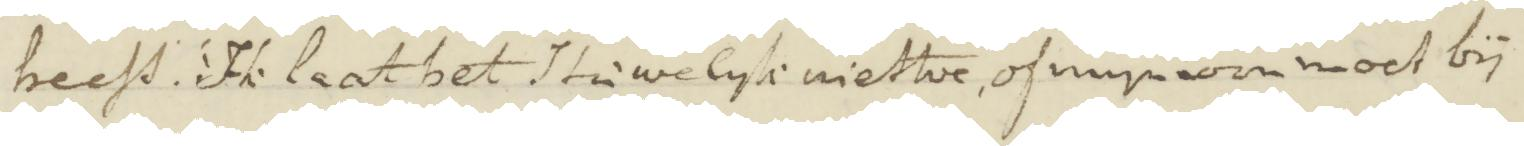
heeft: 'Jk laat het Huwelyk niettoe, of myn zoon moet bij
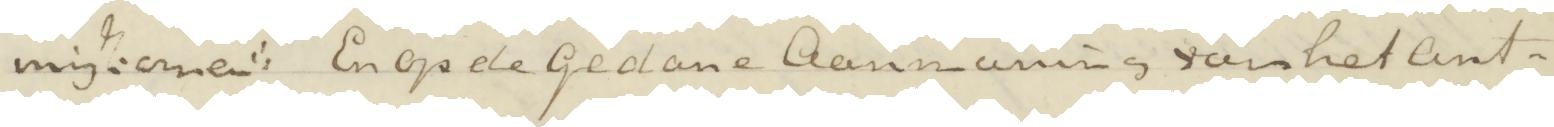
mij komen'. En op de Gedane Aanneming van het ant-
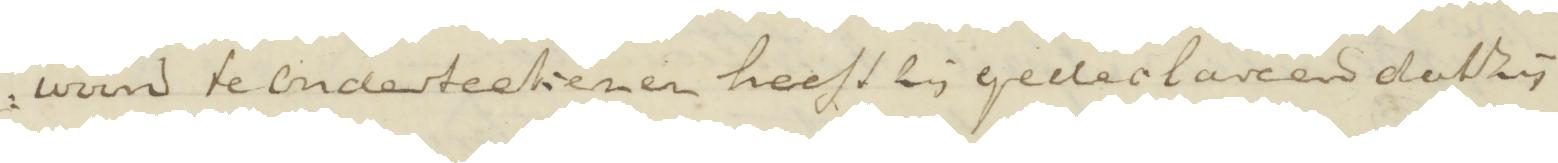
=woord te onderteekenen heeft hij gedeclareerd dat zij
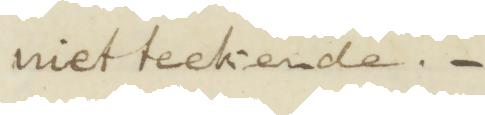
niet teekende. –
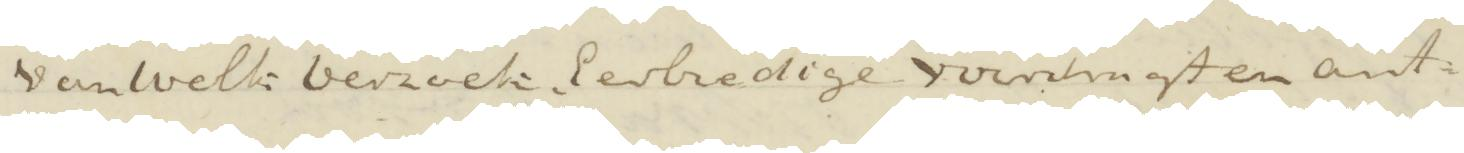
van welk verzoek Eerbiedige voordragt en ant=
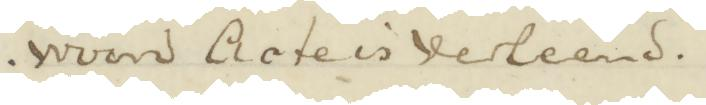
. woord Acte is verleend.
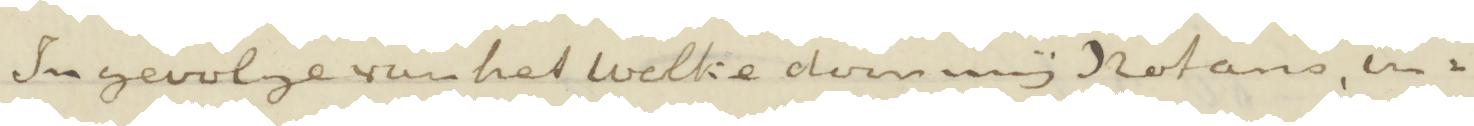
Jngevolge van het welke door mij Notaris, in=
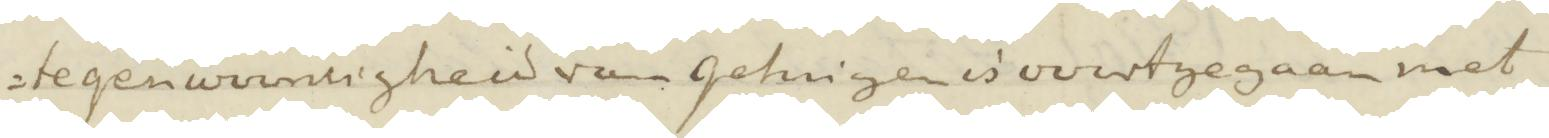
=tegenwoordigheid van getuigen is voortgegaan met
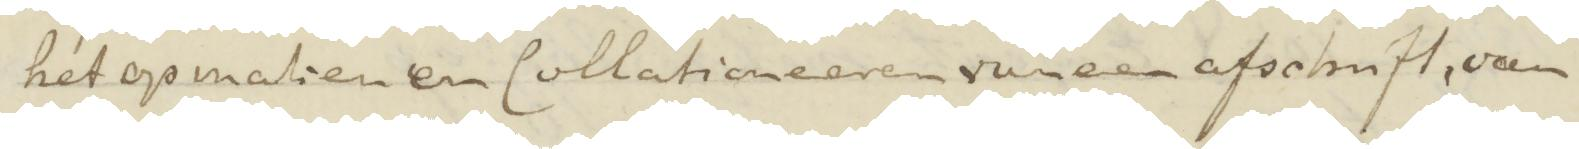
het opmaken en Collationeeren van een afschrift, van
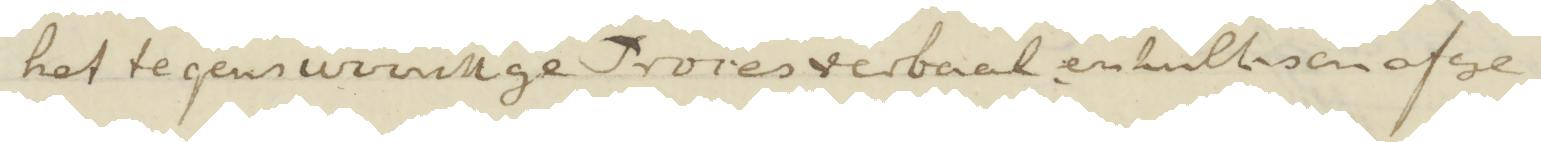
het tegenwoordige Proces Verbaal, en zulks van afge
